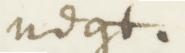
regt.
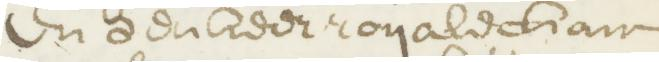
En den heer roijalechan
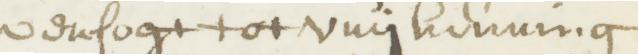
versogt tot vrijkeuring
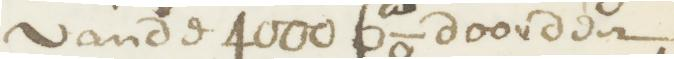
van de 4000 p a/o door den
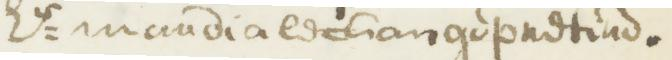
h=r mandialechan gepretend.t
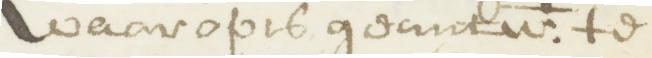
waar op is geantw:t te
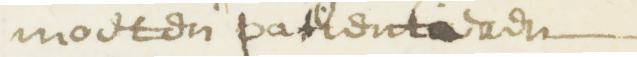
moeten patientieren
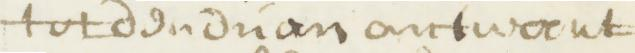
tot den duan antwoort
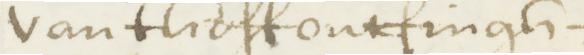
van ’t hoff ontfingh
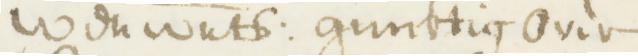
werwrts: gunstig over
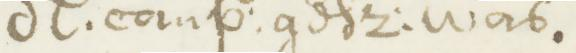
d E. comp:s gesz: was.
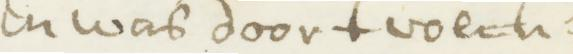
En was door ’t volck
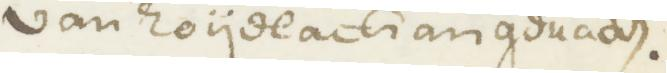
van roijelachan geraden.
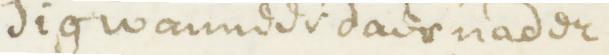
sig wanneer daer nader
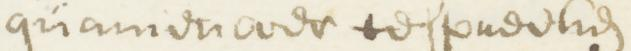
quamen aen te spreeken
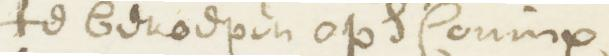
te beroepen op 's Coninx
